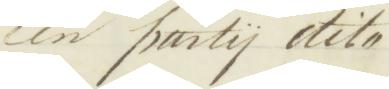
Een partij dito
